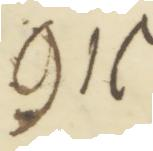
915
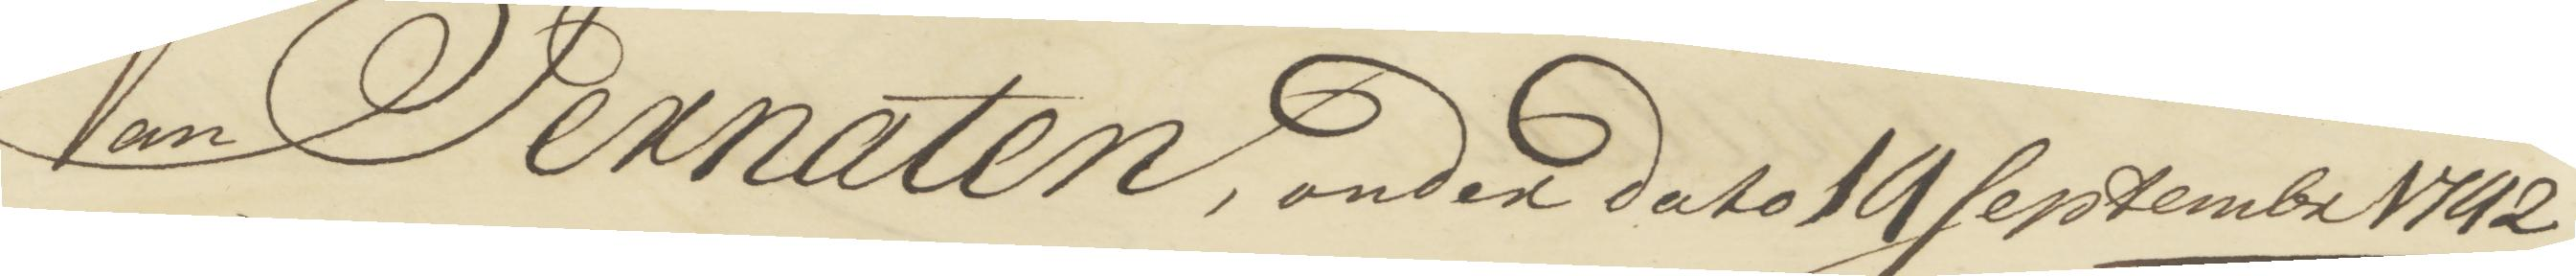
Van Ternaten, onder dato 14 septembr 1742
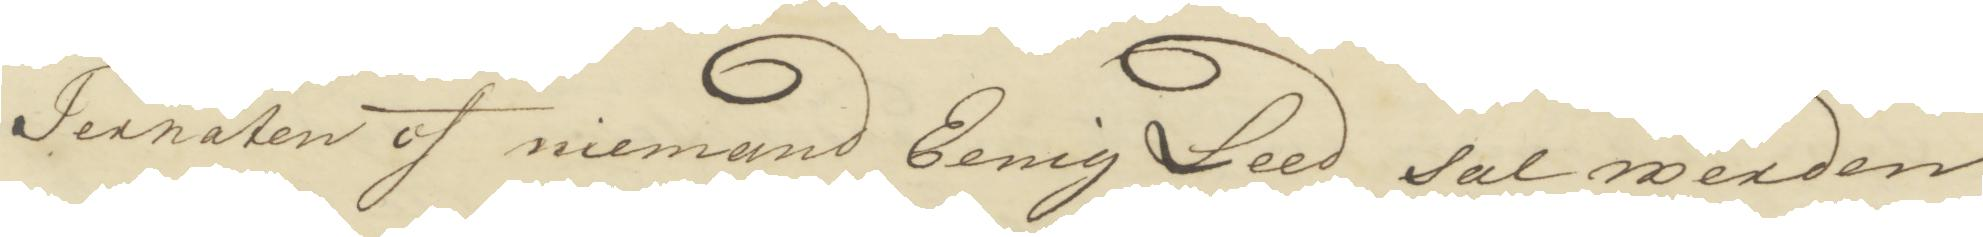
Ternaten of niemand Eenig Leed sal werden
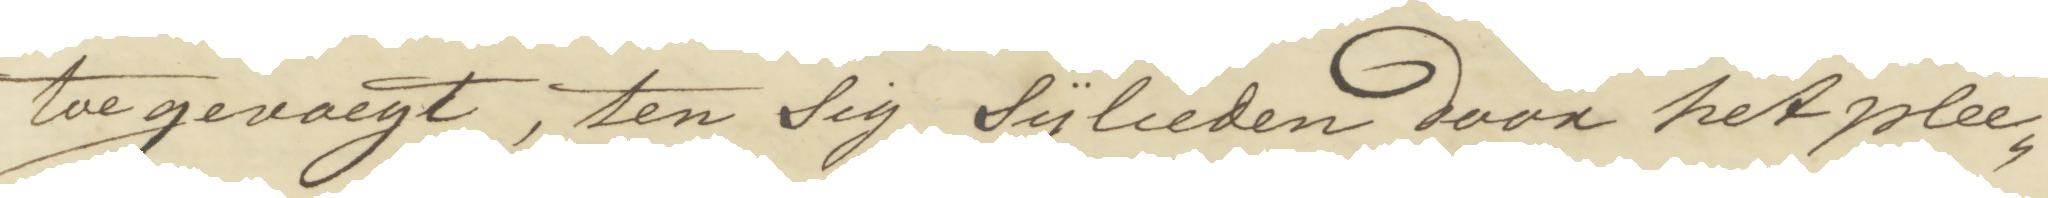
toegevoegt, ten sig sij lieden door het plee„
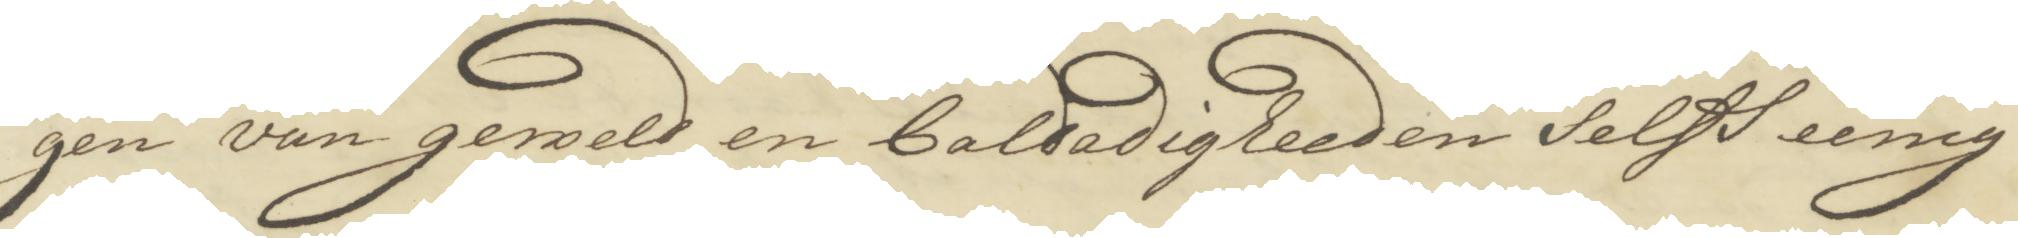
gen van geweld en baldadigheeden selfs eenig
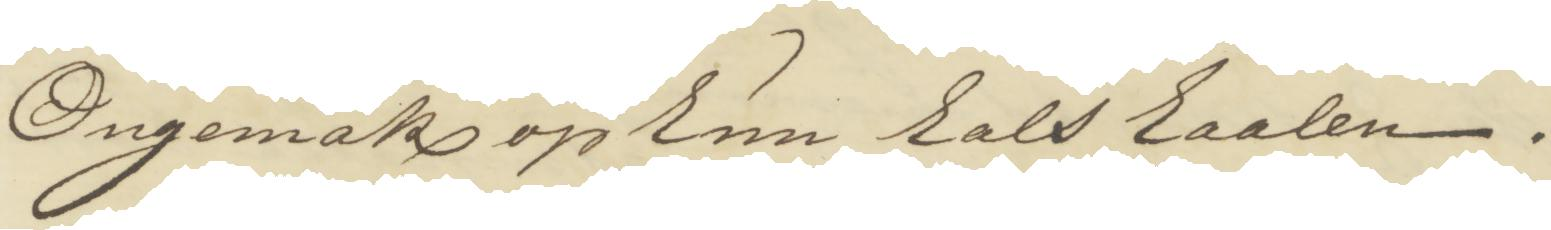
Ongemak op hun hals haalen.
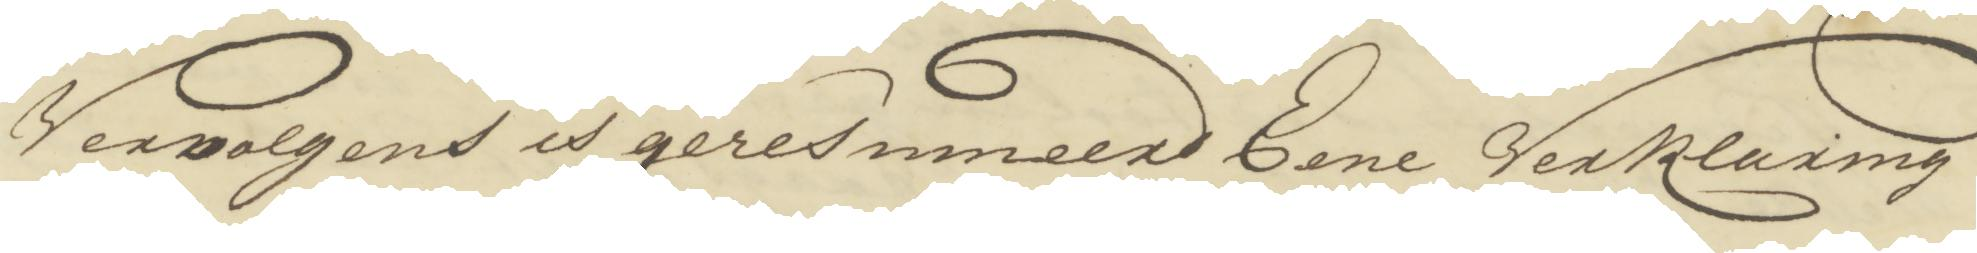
Vervolgens is geresumeerd Eene Verklaring
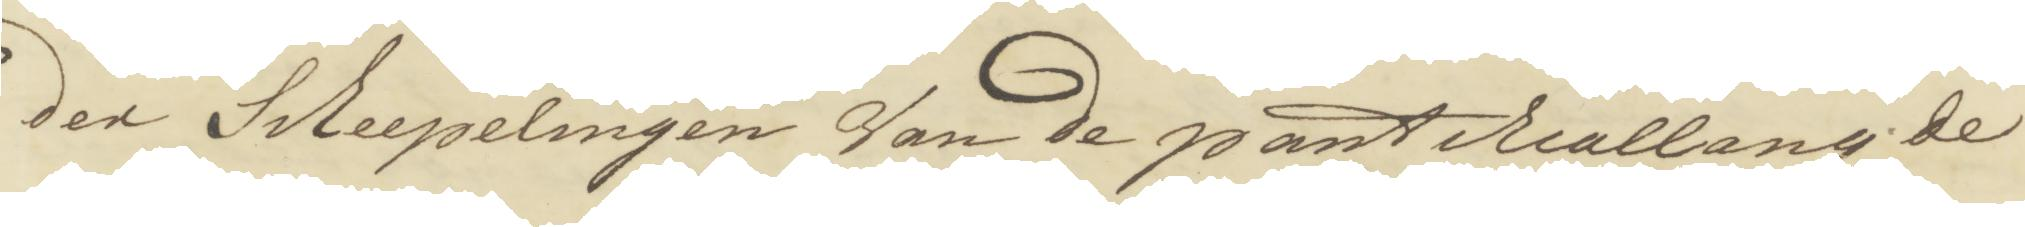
der scheepelingen van de pantchiallang de
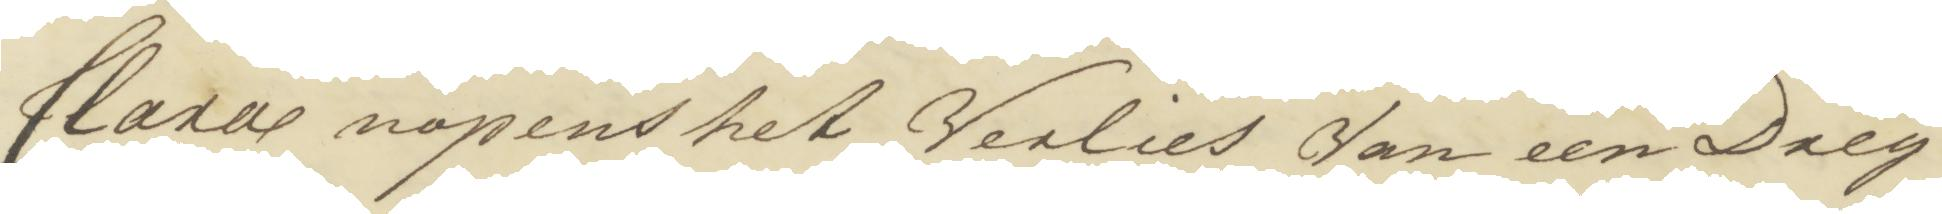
Clara nopens het Verlies van een Dreg
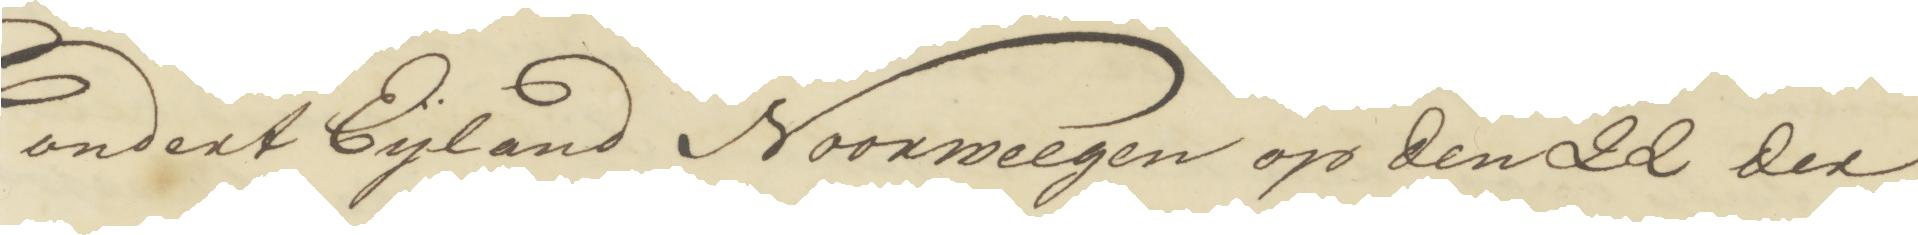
ondert Eijland Noorweegen op den 22 der
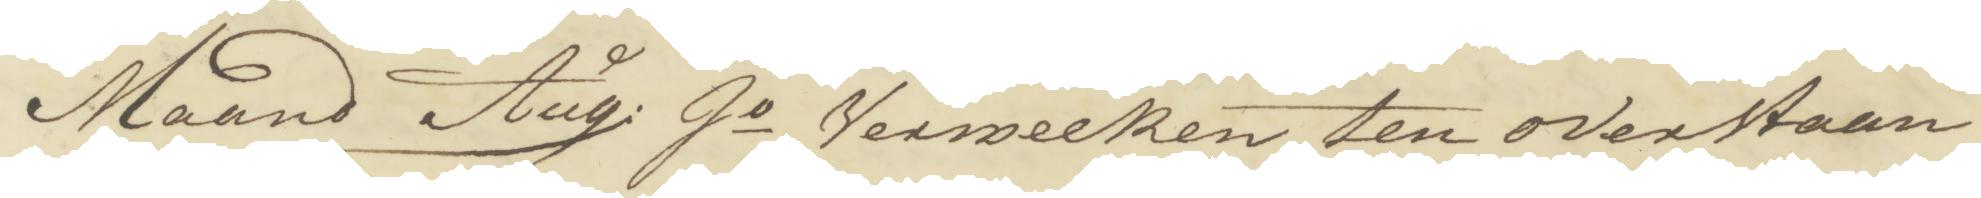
Maand Aug: J–o verweeken ten overstaan
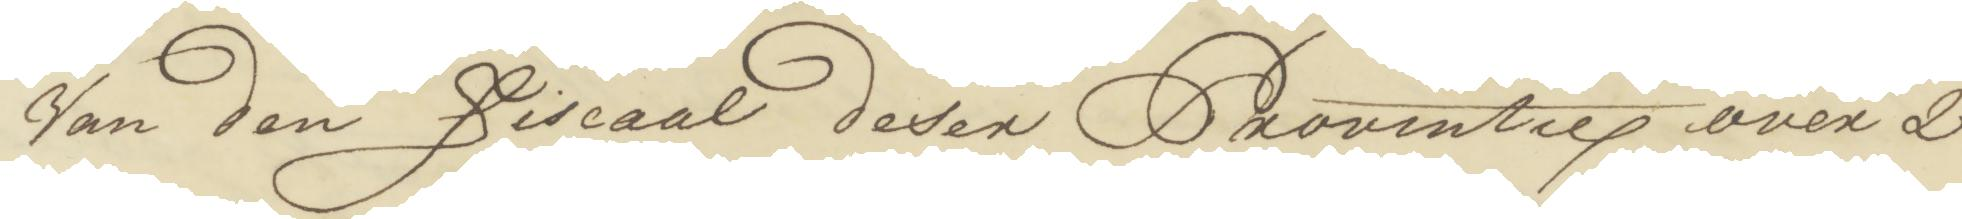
van den fiscaal deser Provintie over 2
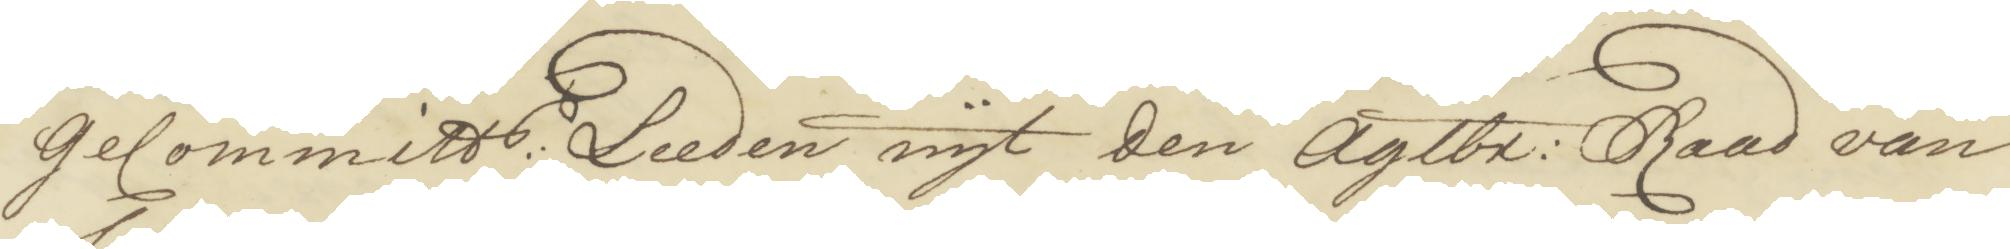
gecommitts: Leeden uijt den Agtbr: Raad van
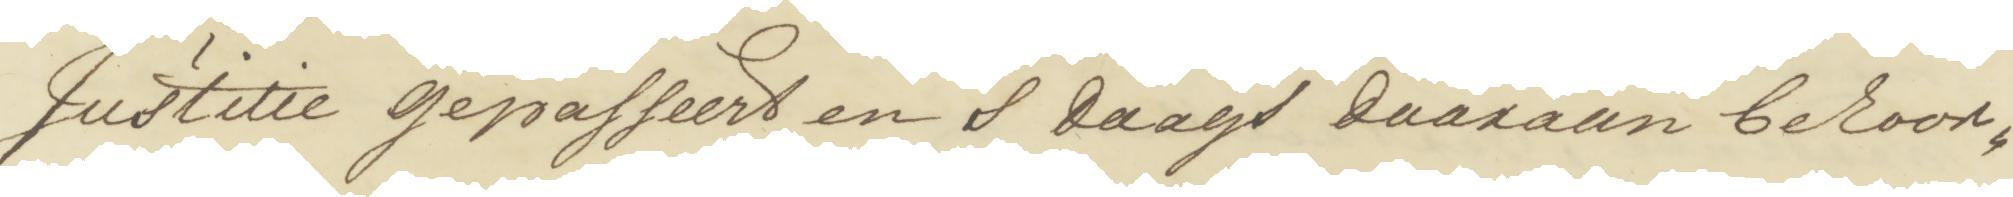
Justitie gepasseert en 's daags daaraan behoor„
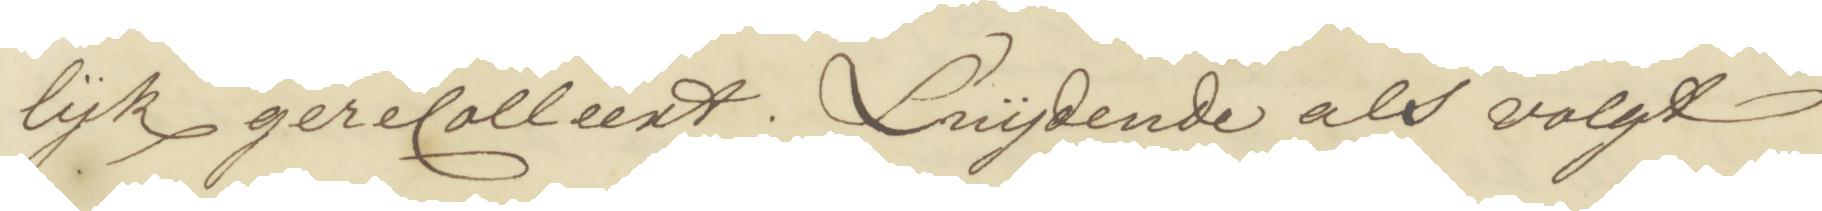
lijk gerecolleert. Luijdende als volgt
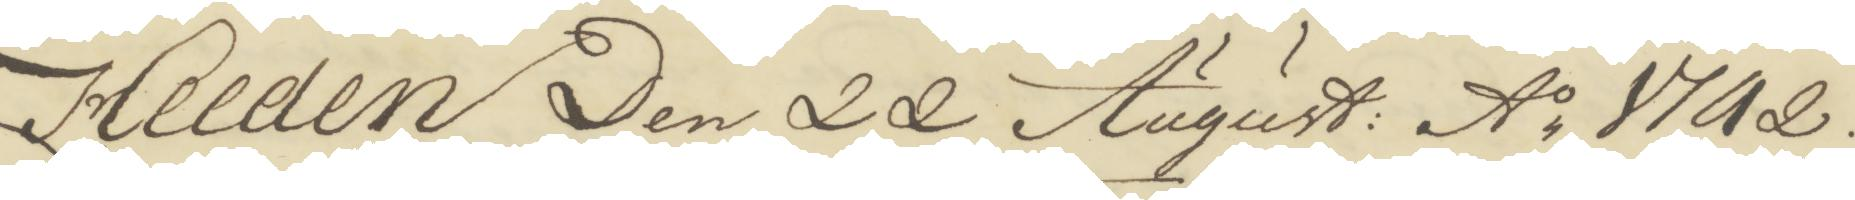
Heeden Den 22 August: A„o 1742
